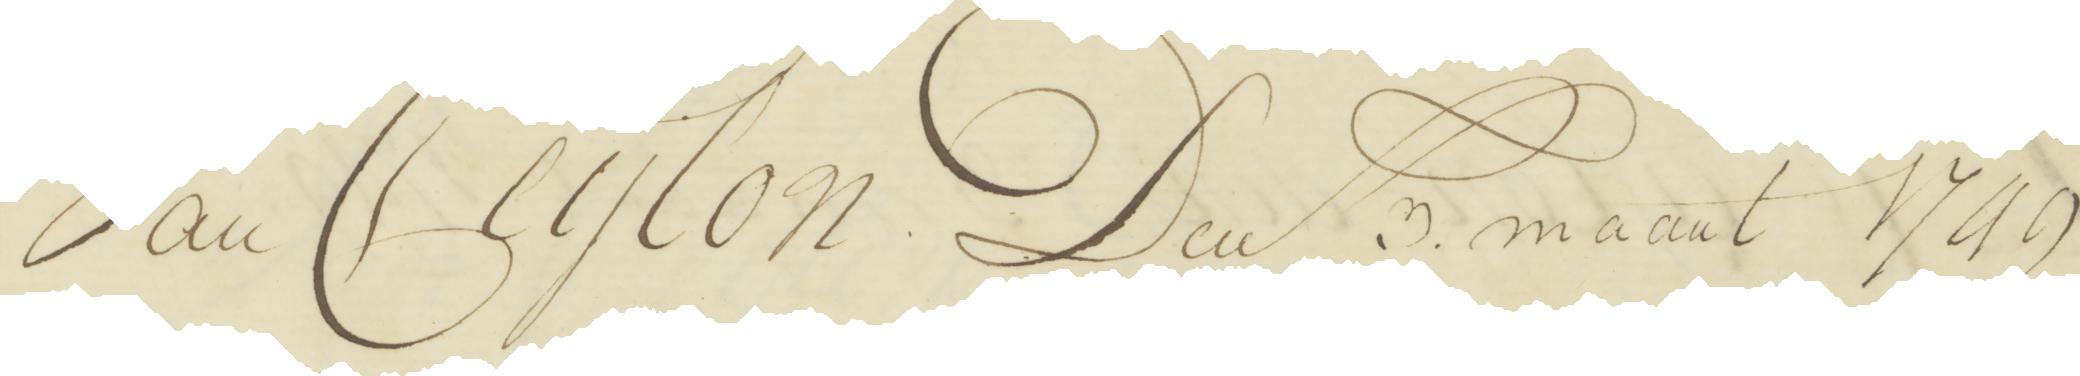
Van Ceijlon, Den 3. maart 1749
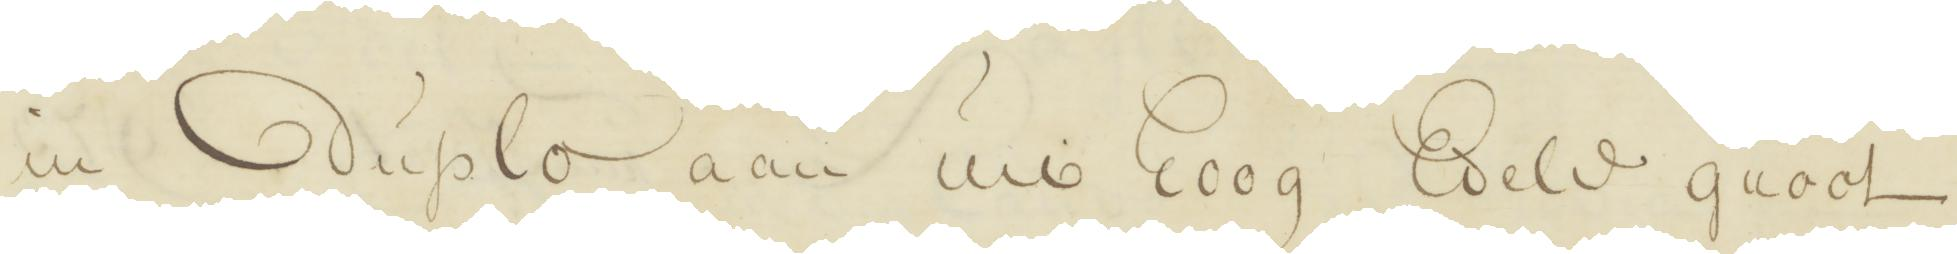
in duplo aan uw hoog Edele groot
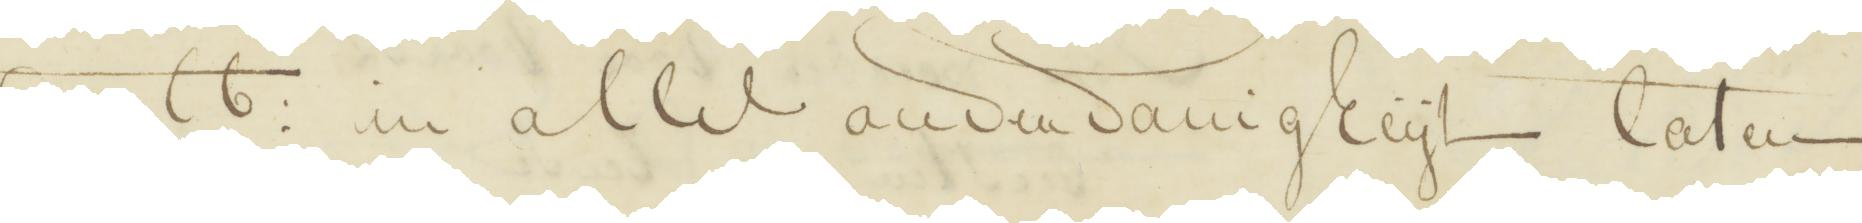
agtb: in alle onderdanigheijt laten
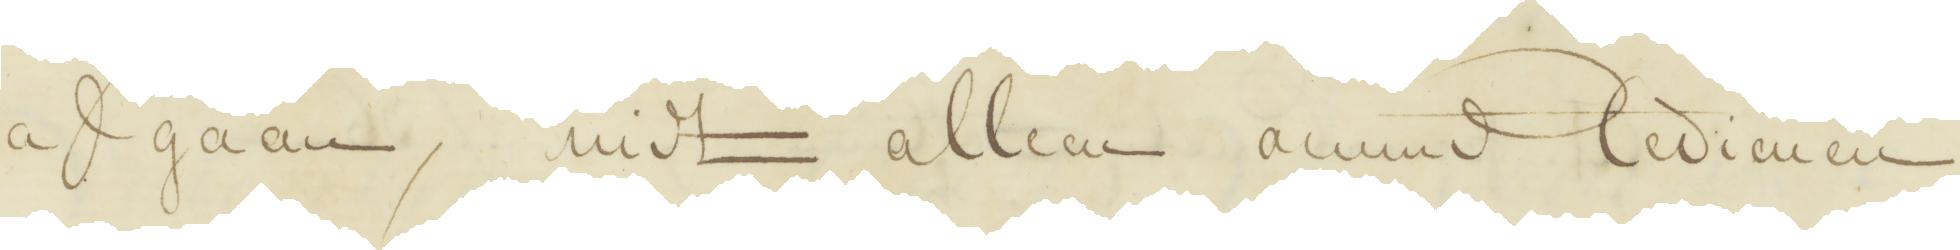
afgaan, niet alleen omme tedienen
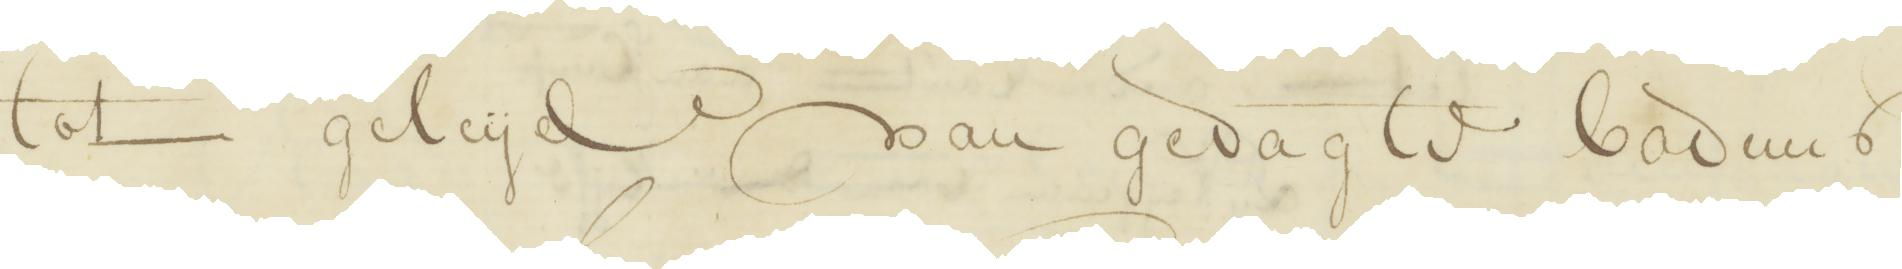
tot geleijde van gedagte bodems
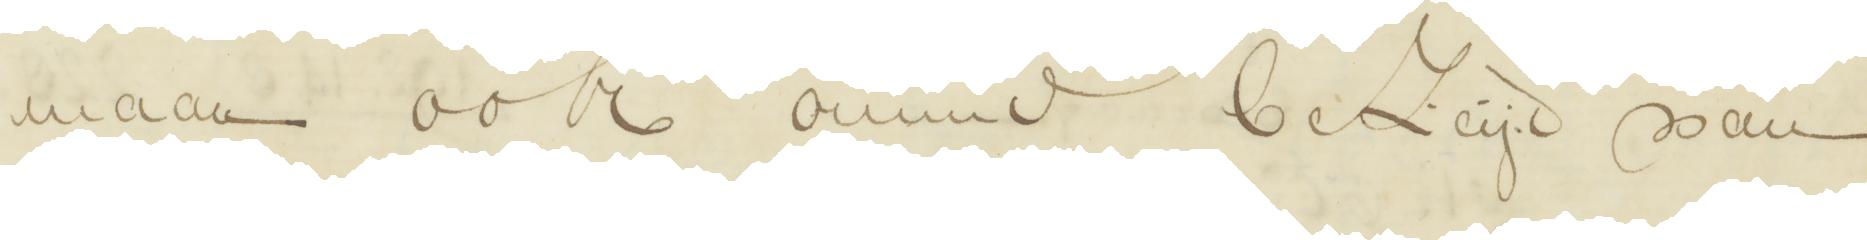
maar ook omme bezeijd van
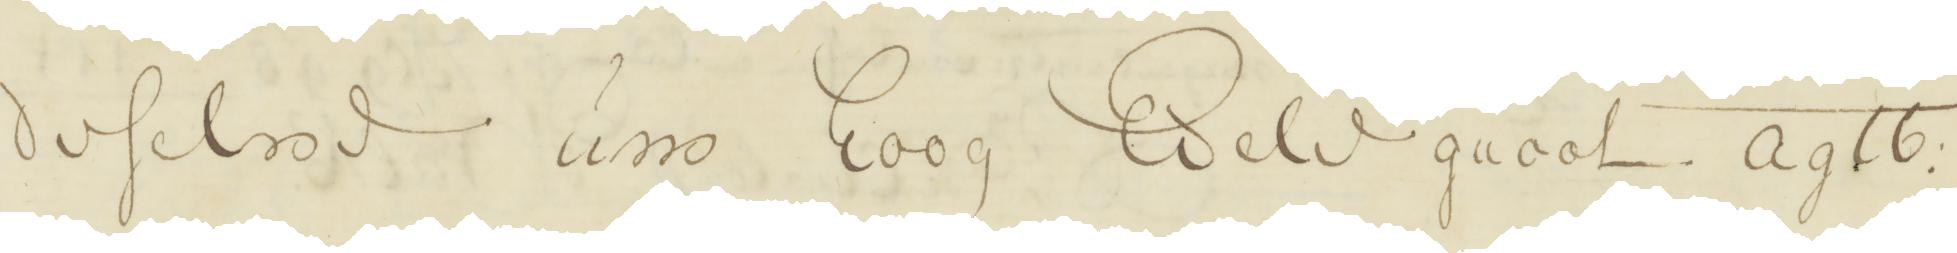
deselve uw hoog Edele groot Agtb:
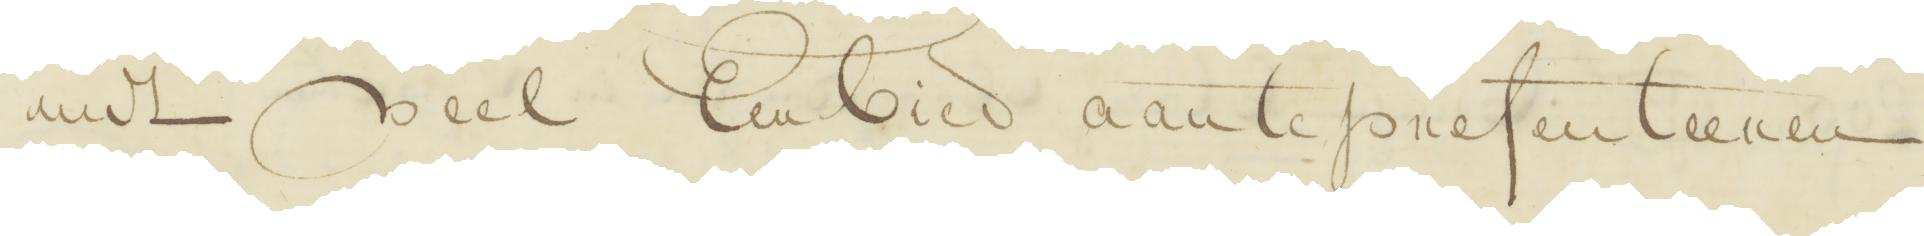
met veel Eerbied aan te presenteeren
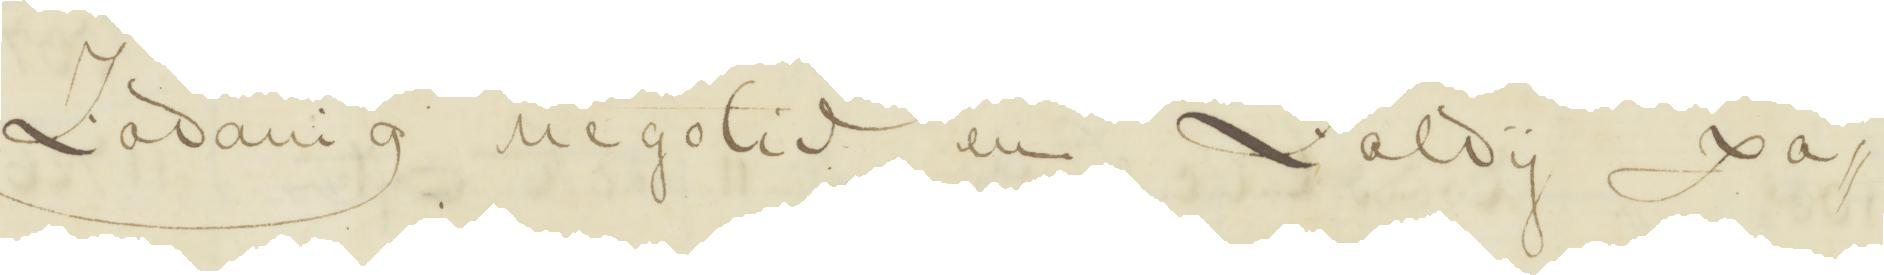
zodanig negotie en zoldij pa„
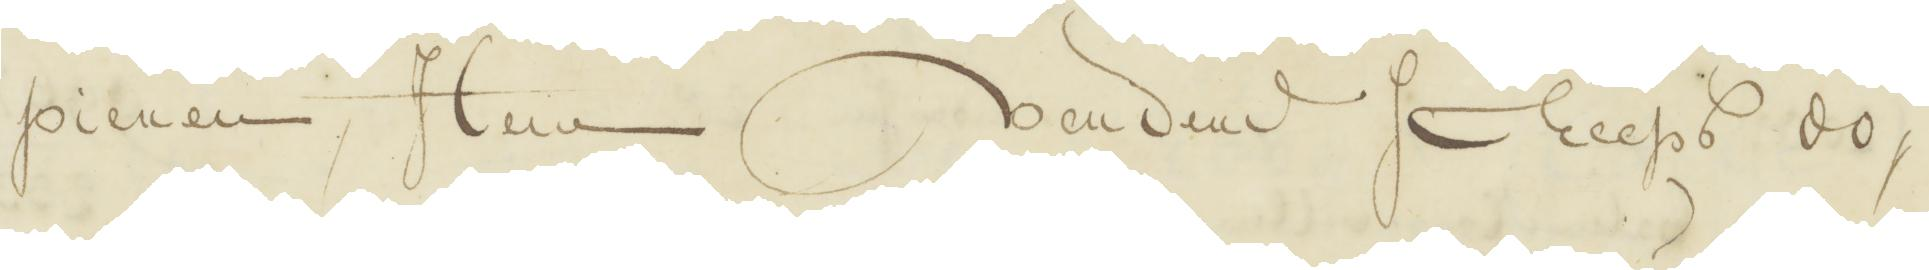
pieren; jtem verdere scheeps do„
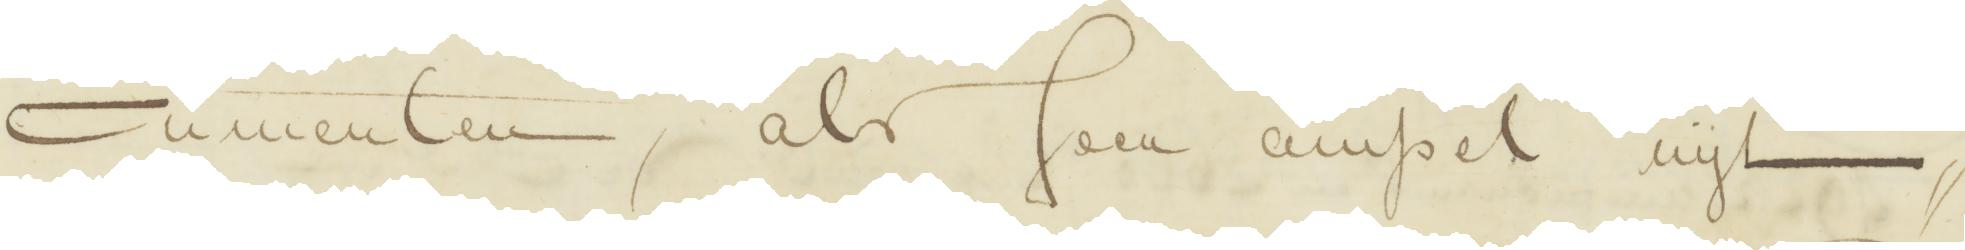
cumenten, als seer ampel uijt„
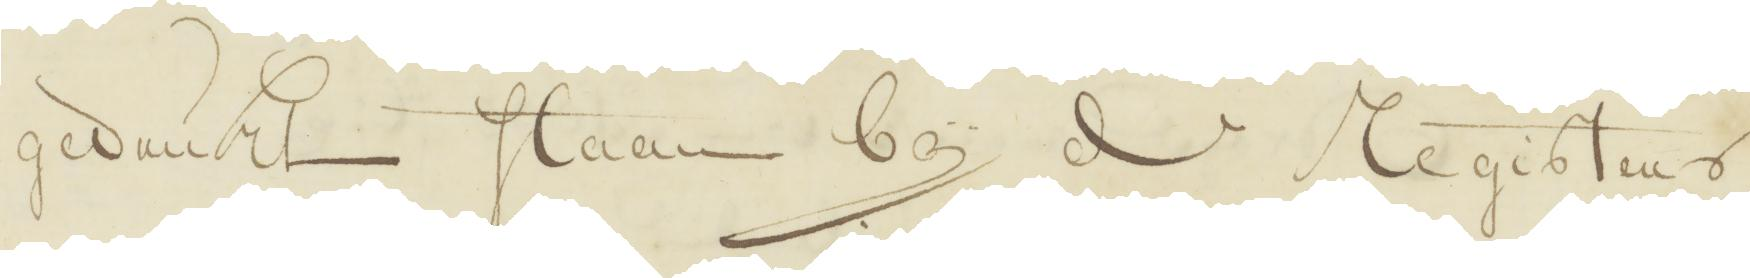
gedrukt staan bij de registers
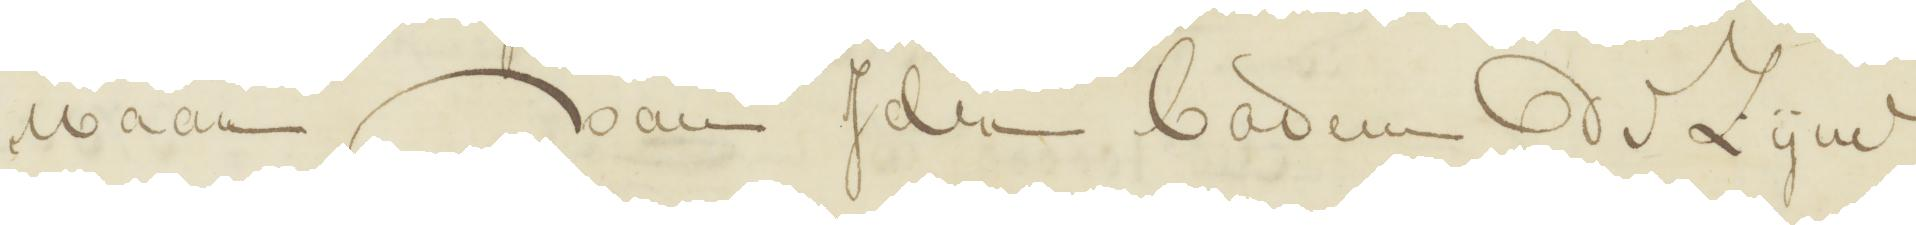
waar van jder bodem de zijne
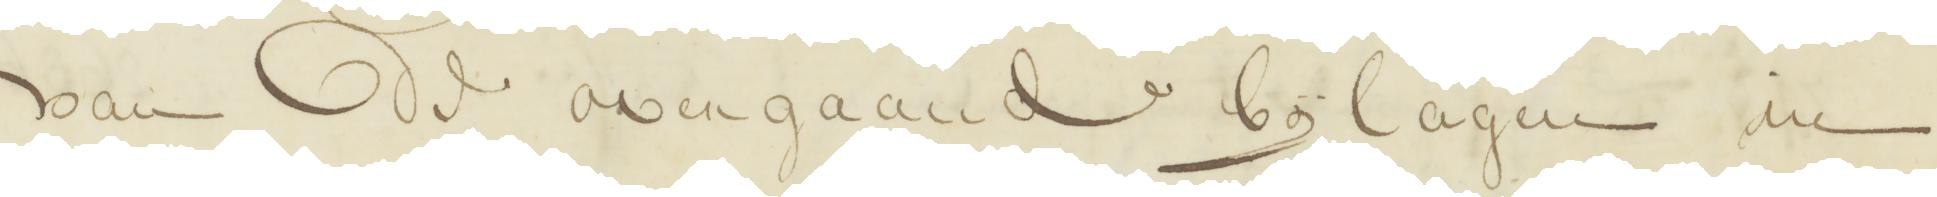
van de overgaande bijlagen in
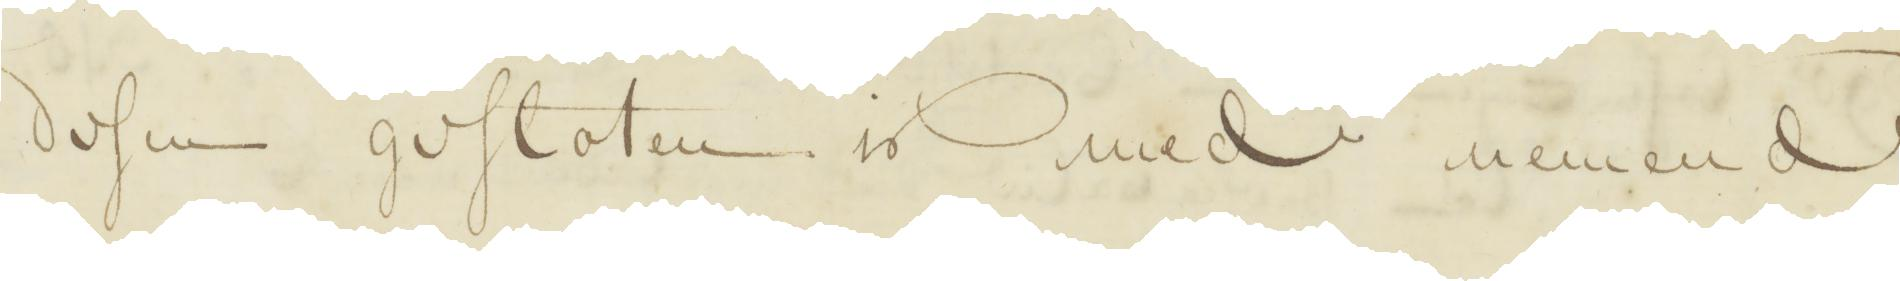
desen gesloten is mede nemen de
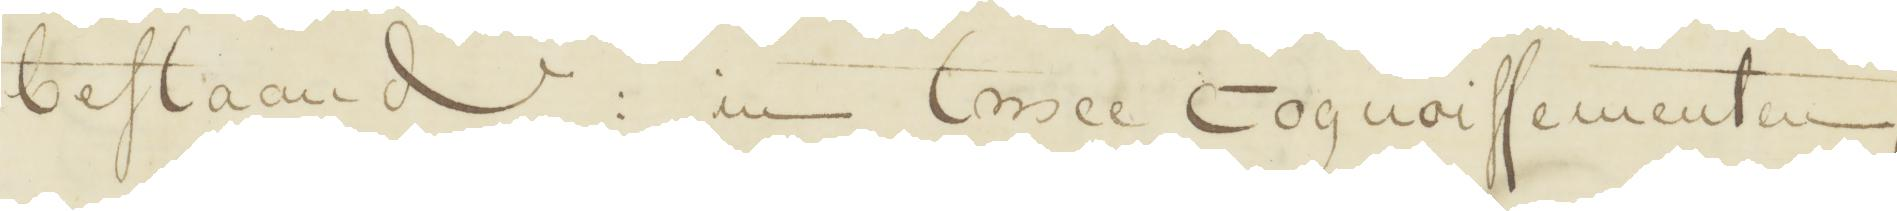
bestaande: in twee cognoissementen,
